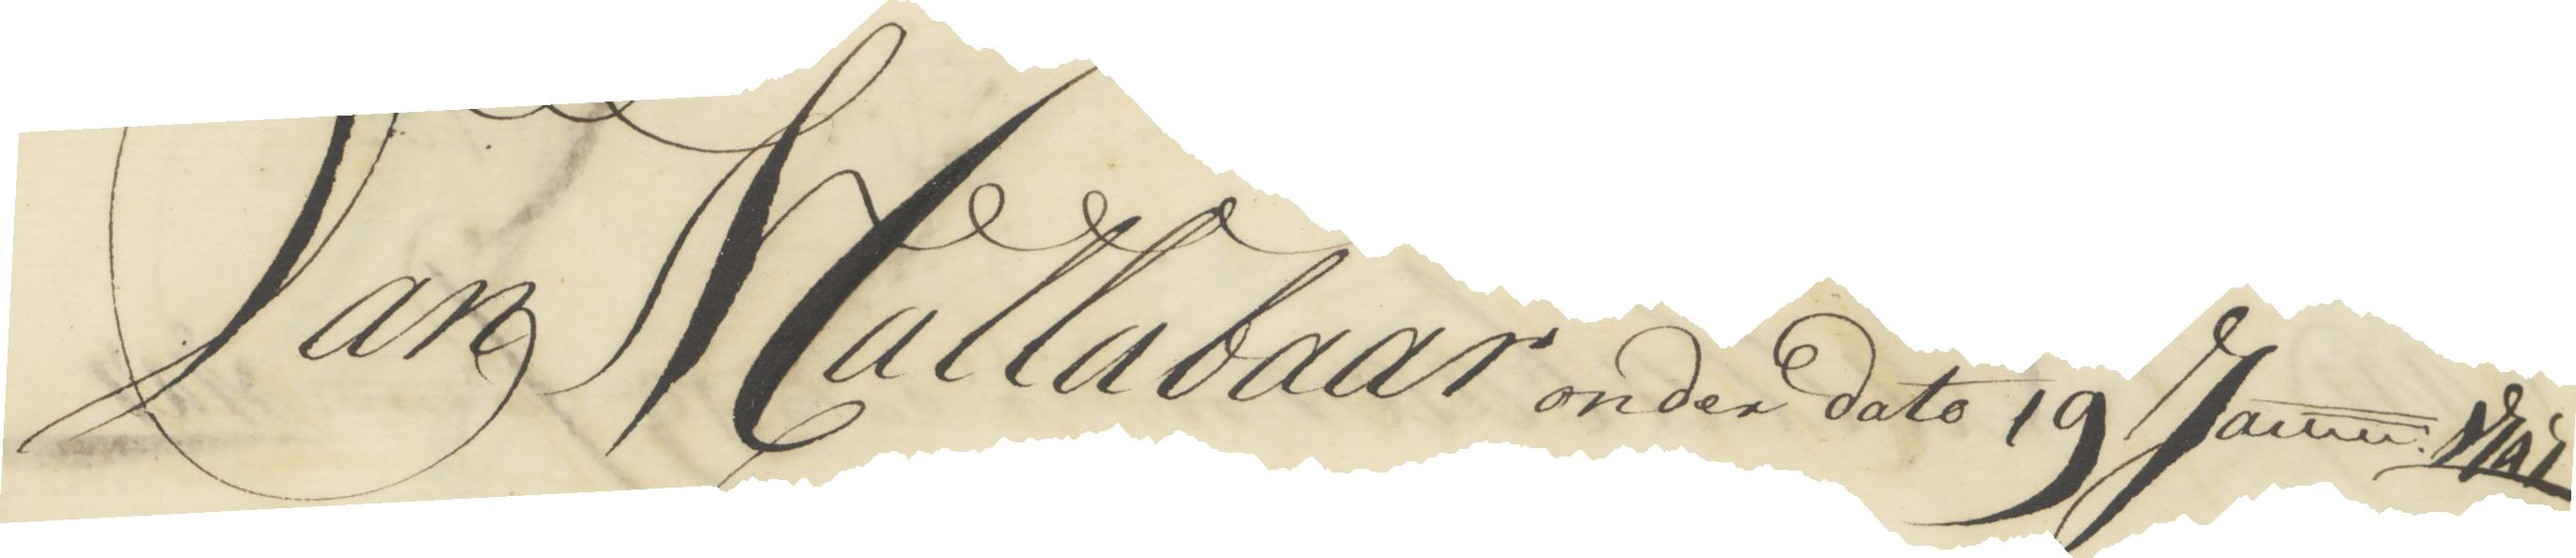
Van Mallabaar onder dato 19 Jann: 1747
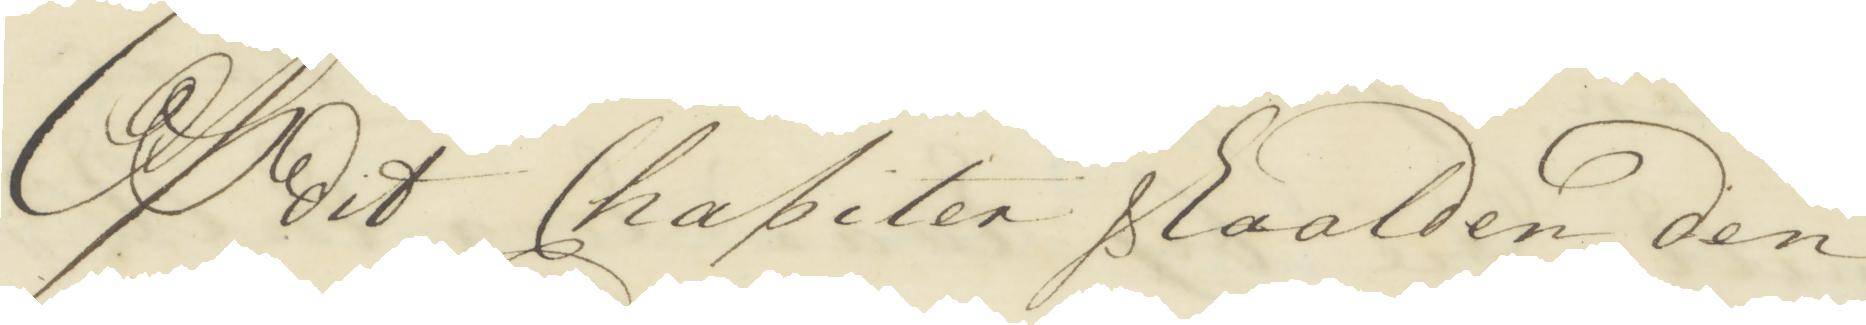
Op dit Chapiter verhaalden den
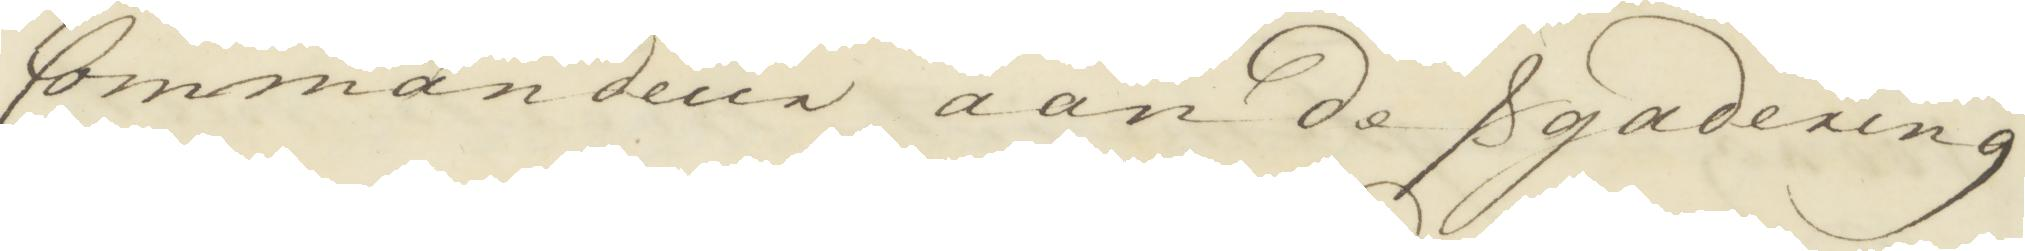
Commandeur aan de vergadering
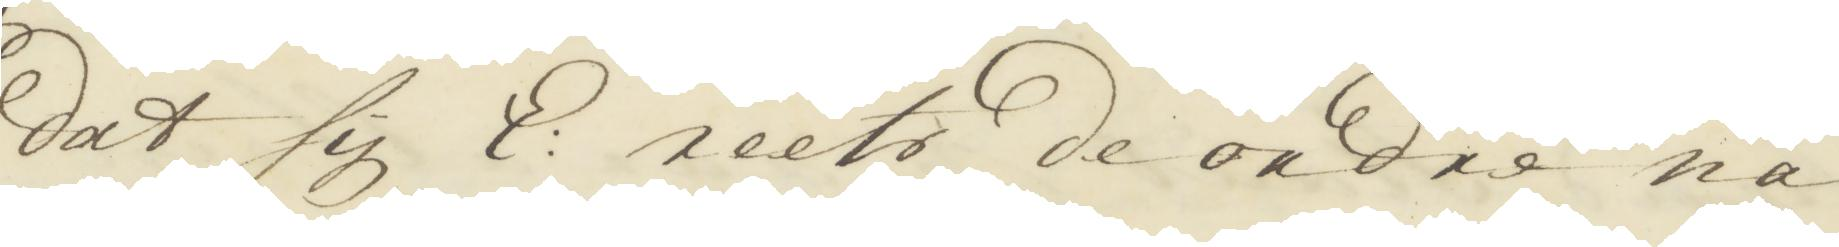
dat sij E: reets de ordre na
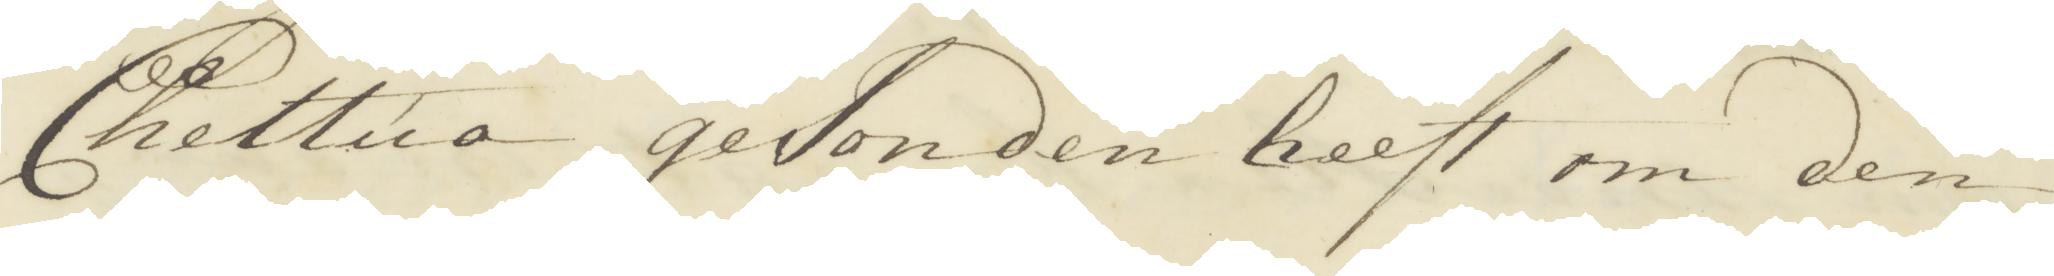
Chettua gesonden heeft om den
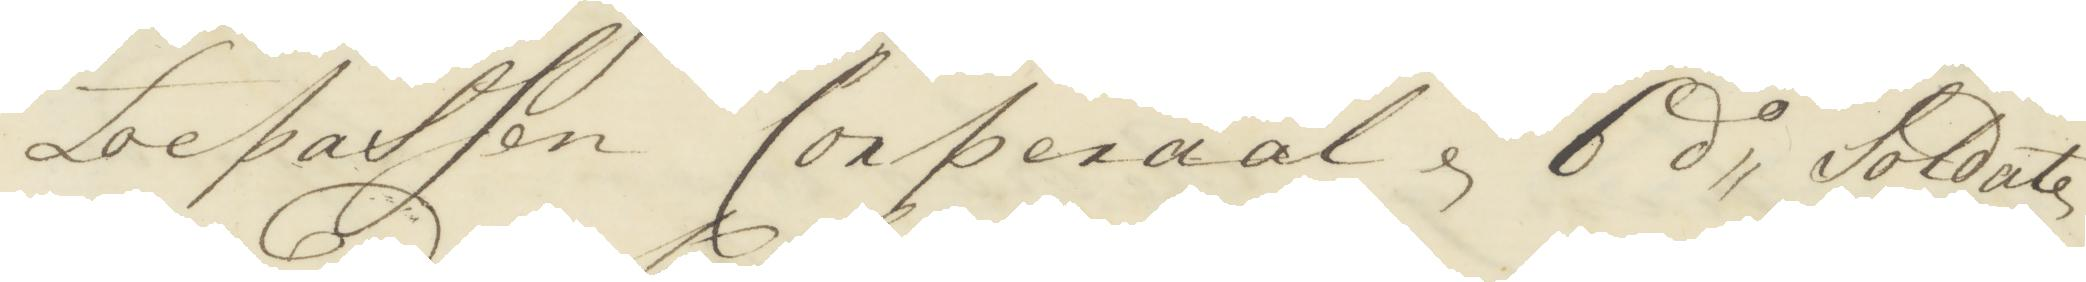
toepassen Corperaal en 6 d„o soldaten
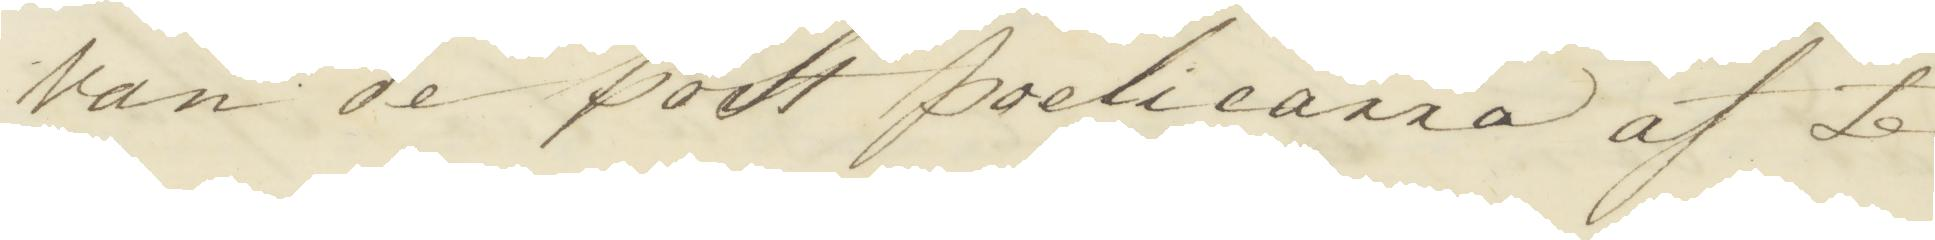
van de post poelicarra af te
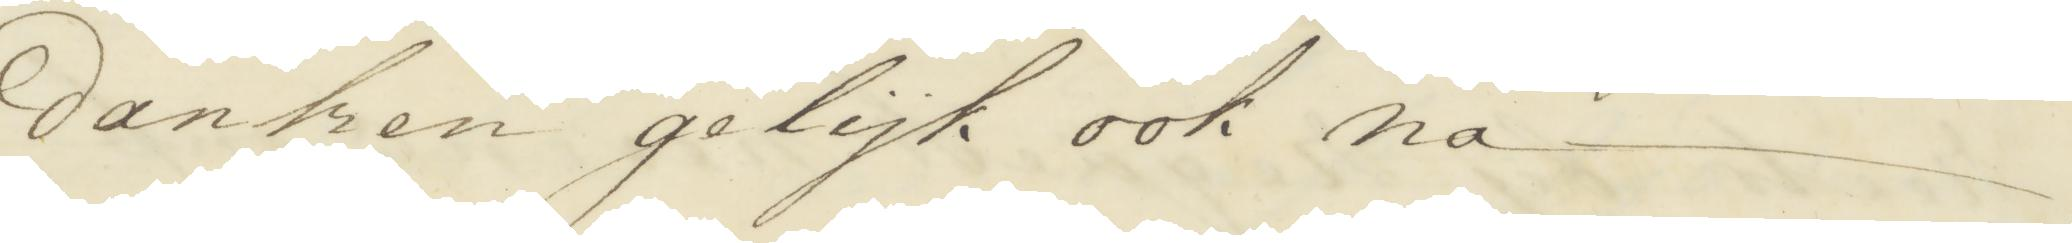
danken gelijk ook na —
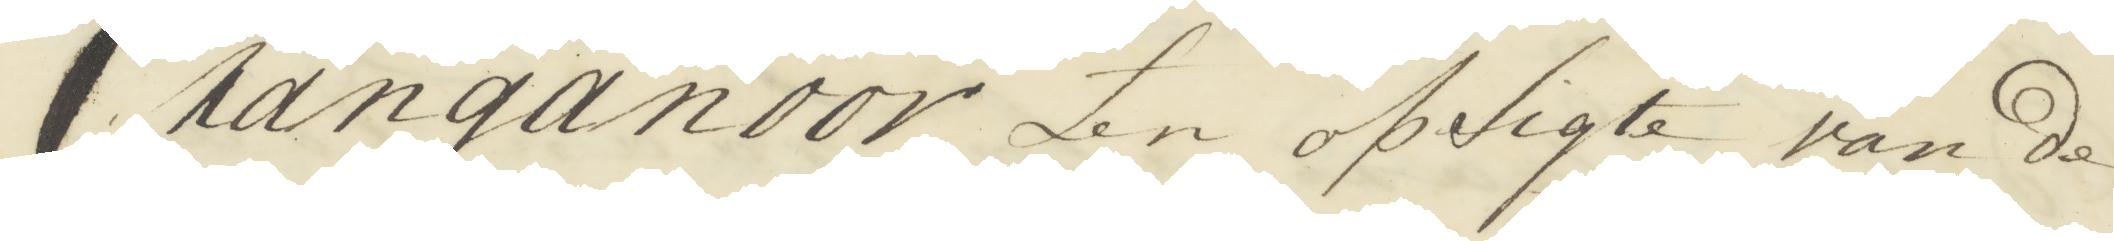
Cranganoor ten opsigte van de
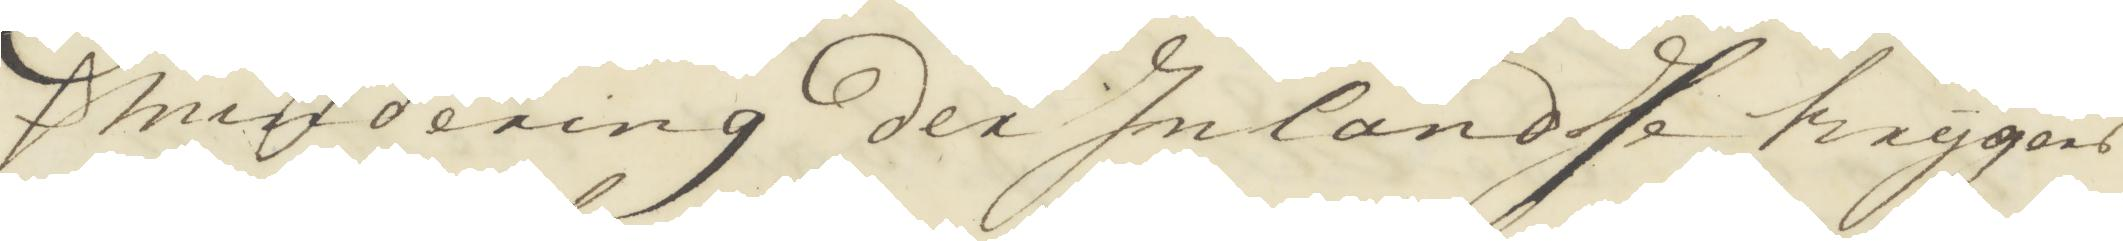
vermindering der Jnlandse krijgers
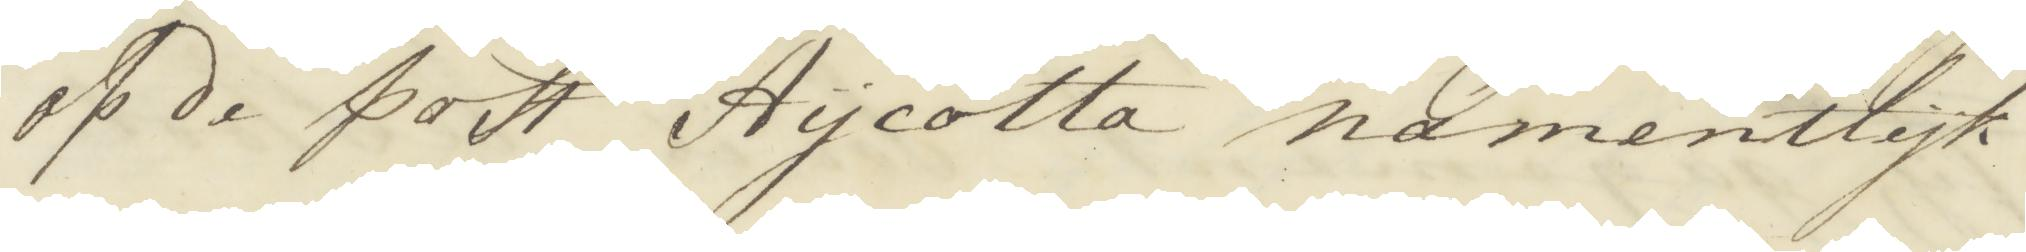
op de post Hijcotta namentlijk
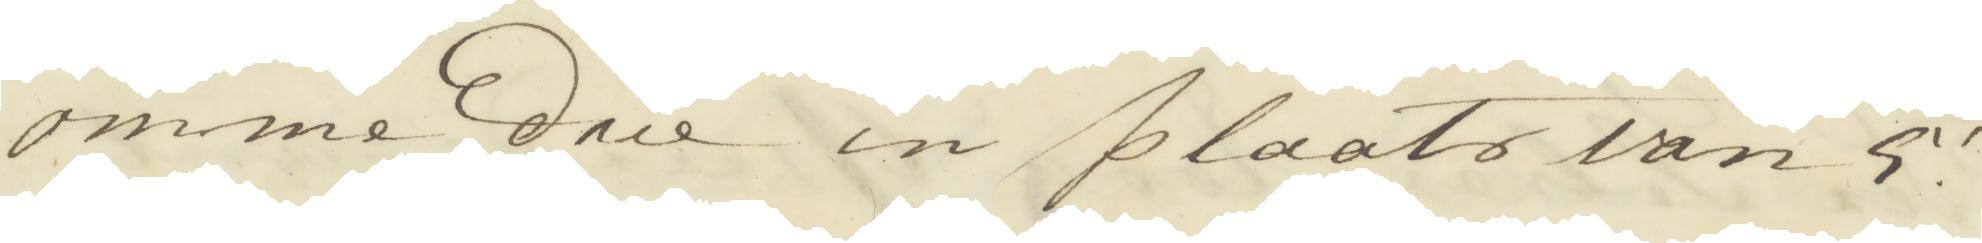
omme drie in plaats van 5:
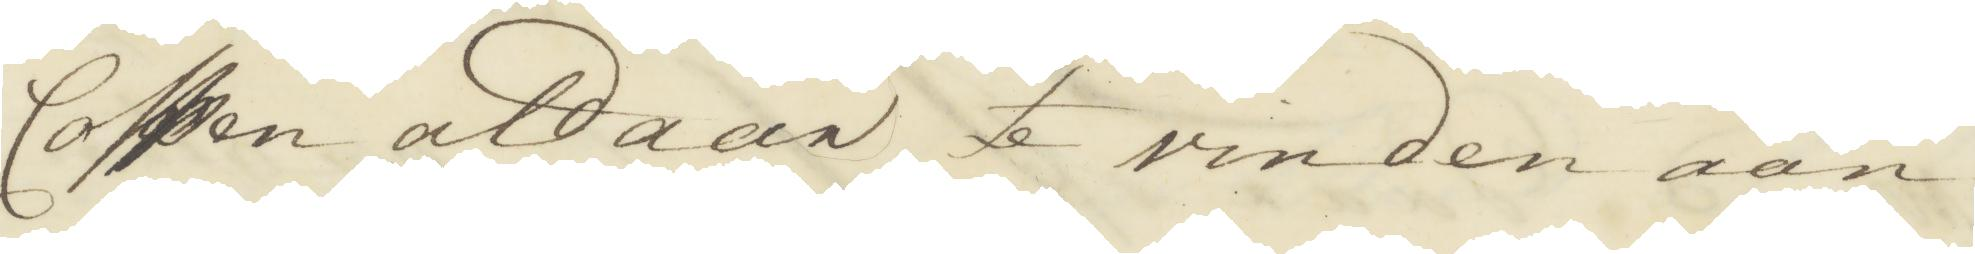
Coppen aldaar te vinden aan
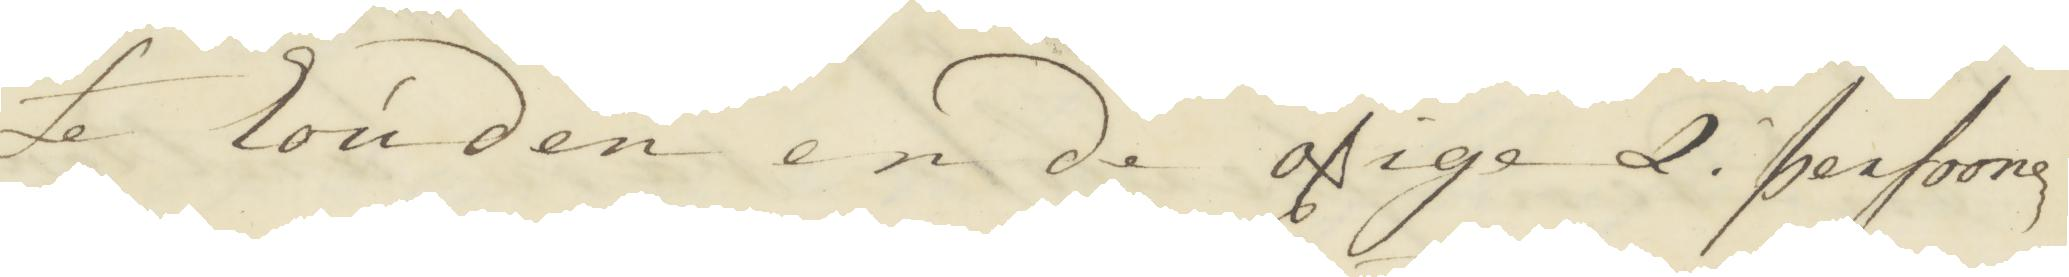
te houden en de overige 2. persoonen
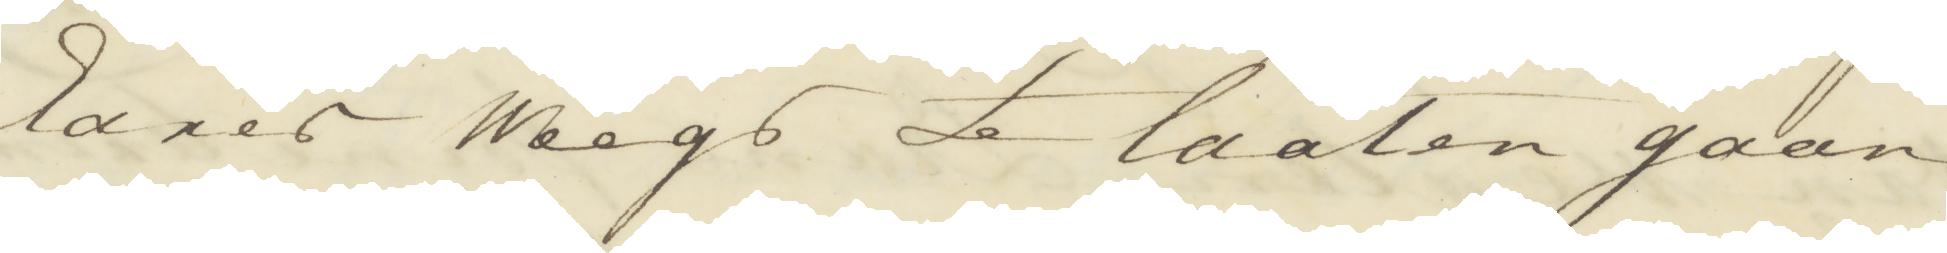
hares weegs te laaten gaan
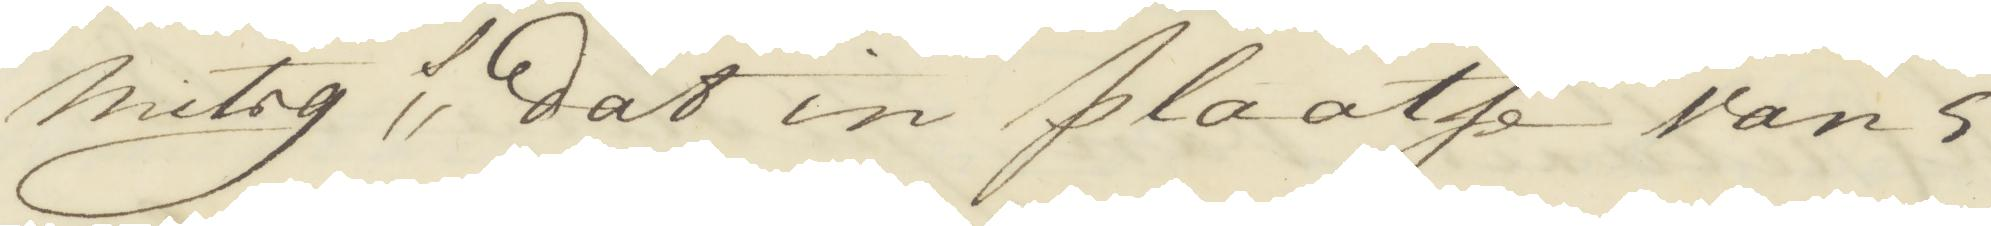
mitsg„s dat in plaatse van 5
